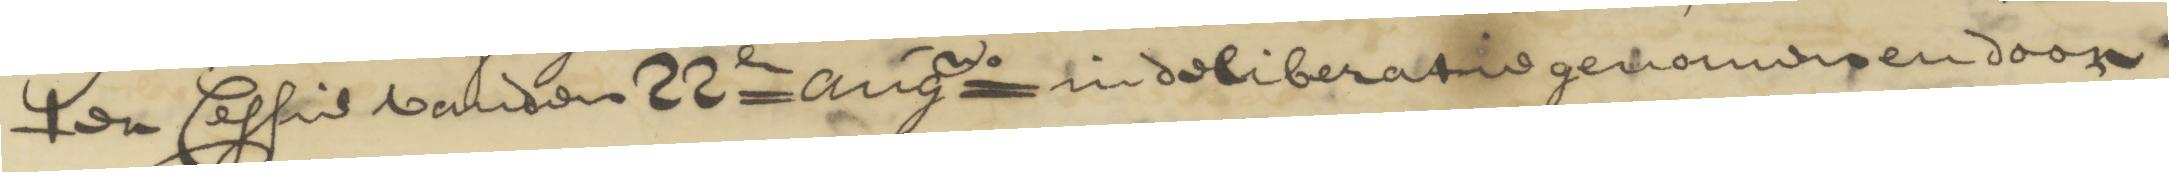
ter Cessie van den 22=en aug=o in deliberate genomen en door
